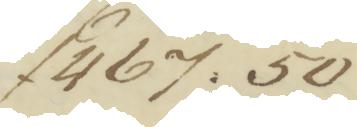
ƒ467: 50
